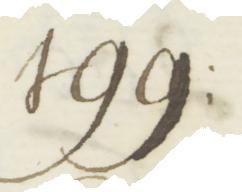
199:
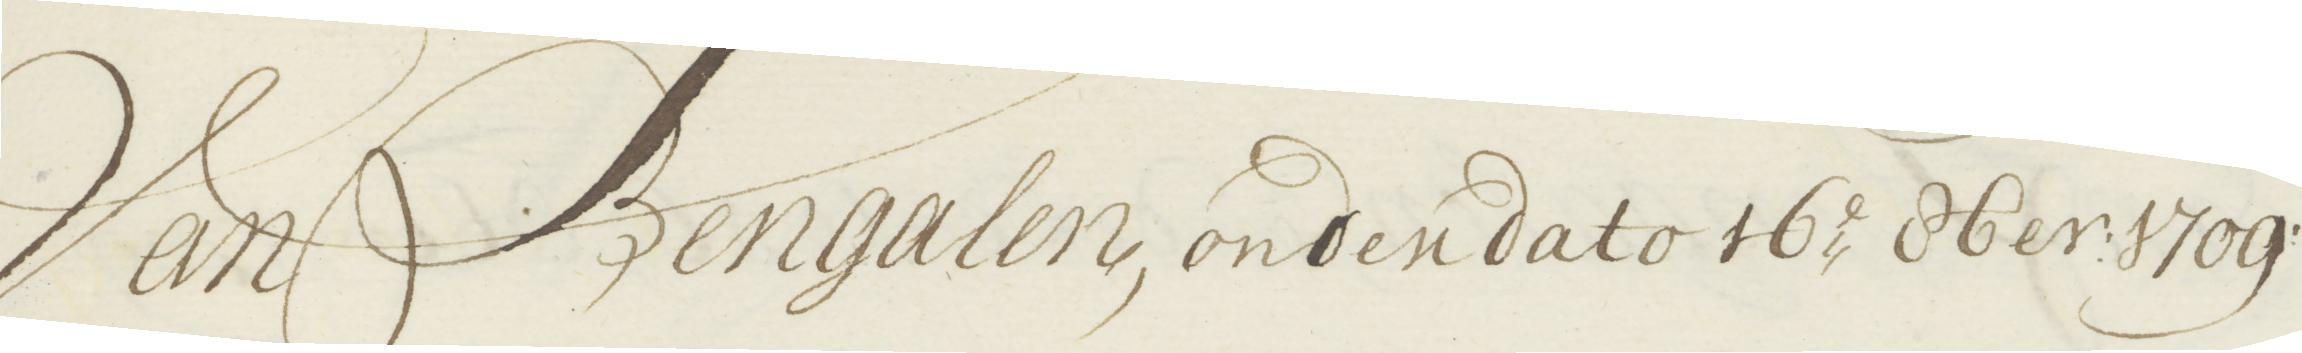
Van Bengalen, onder dato 16„e 8ber: 1709.
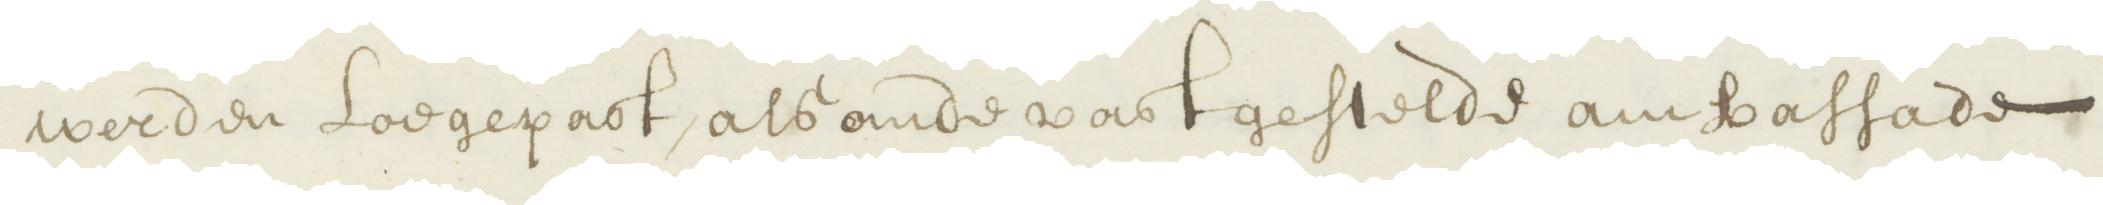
werden toegepast, als omde vastgestelde ambassade
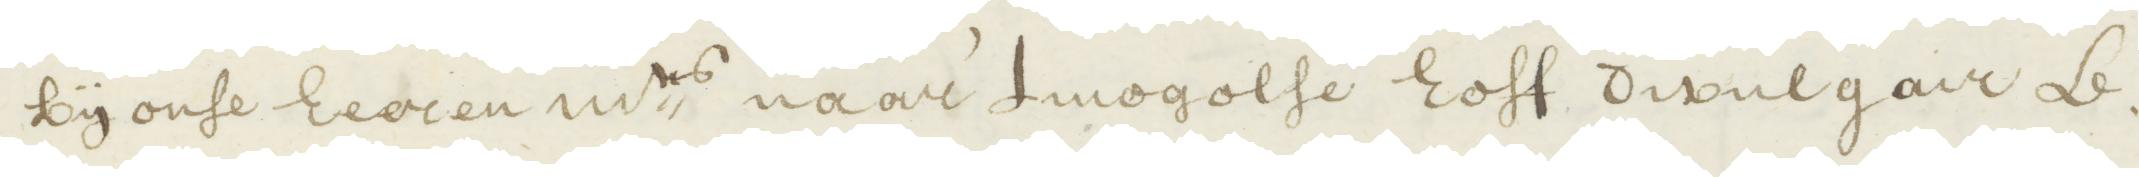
bij onse heeren m„rs naar 't mogolse hoff divulgair te„
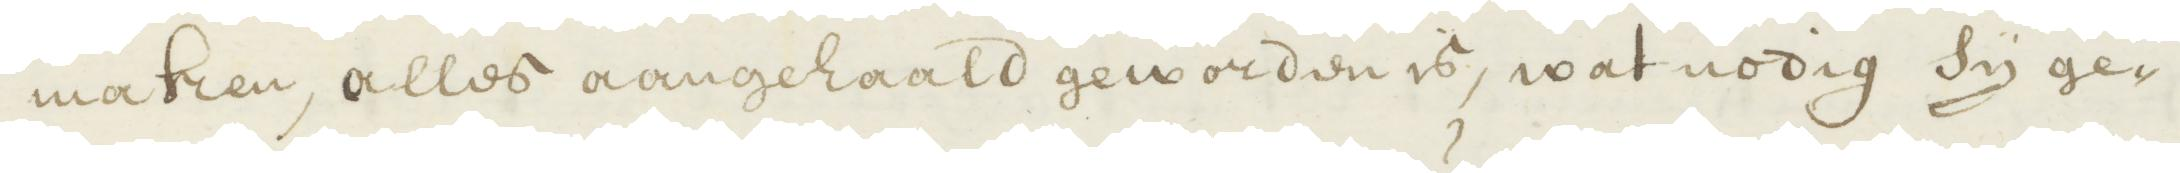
maken, alles aangehaald geworden is, wat nodig sij ge„
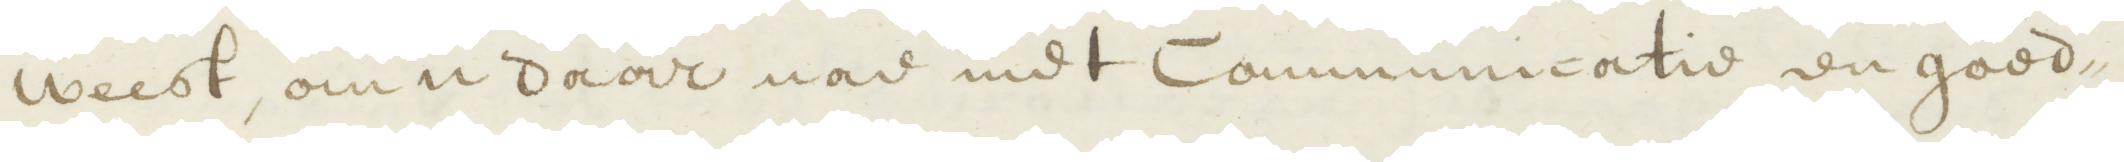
weest, om u daar nae met Communicatie en goed„
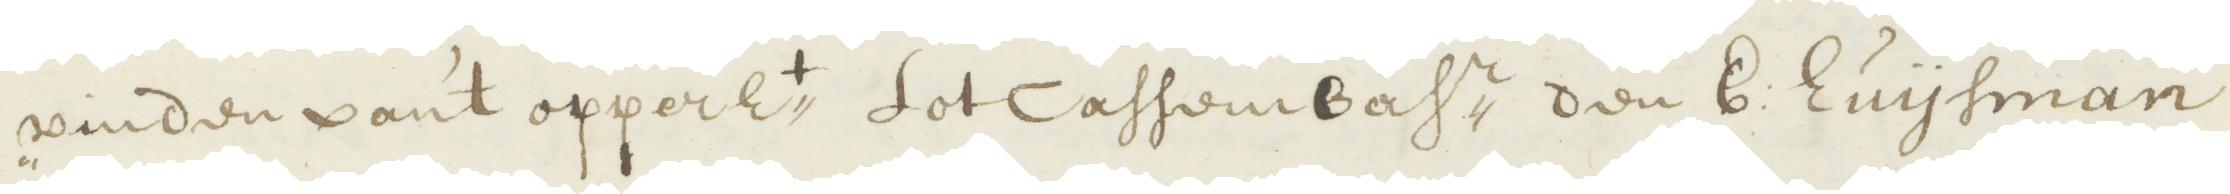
„vinden van 't opperh„t tot Cassembas„r den E: huijsman
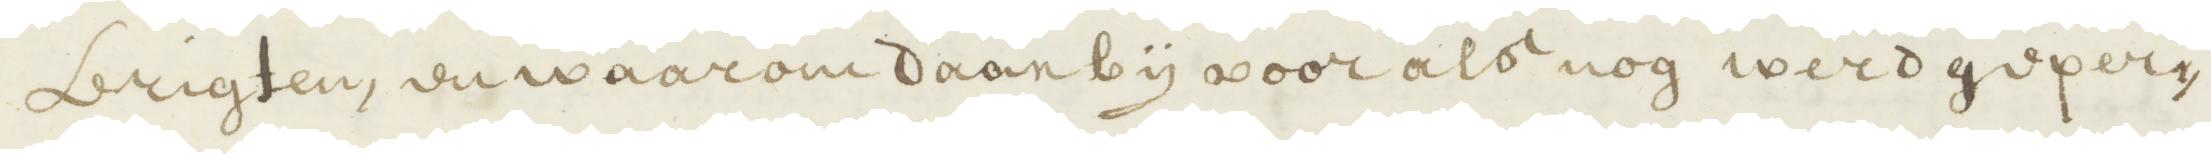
terigten, en waarom daar bij voor als nog werd geper„
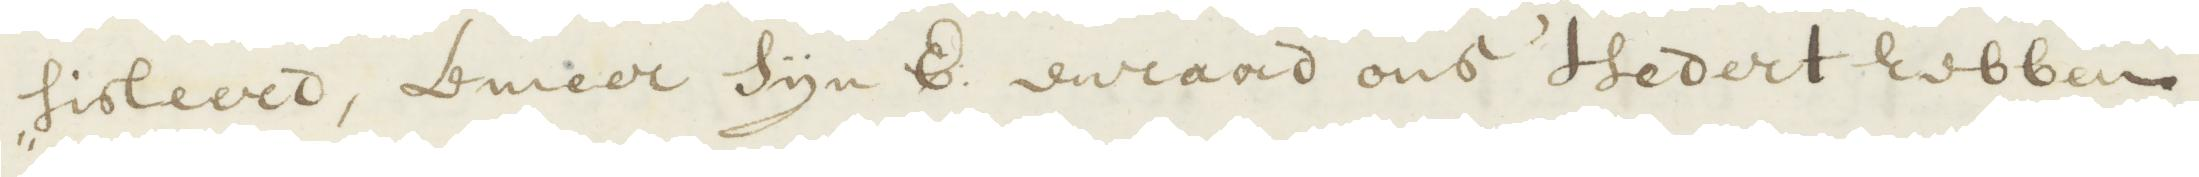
„sisteerd, te meer sijn E: enraad ons 'tsedert hebben
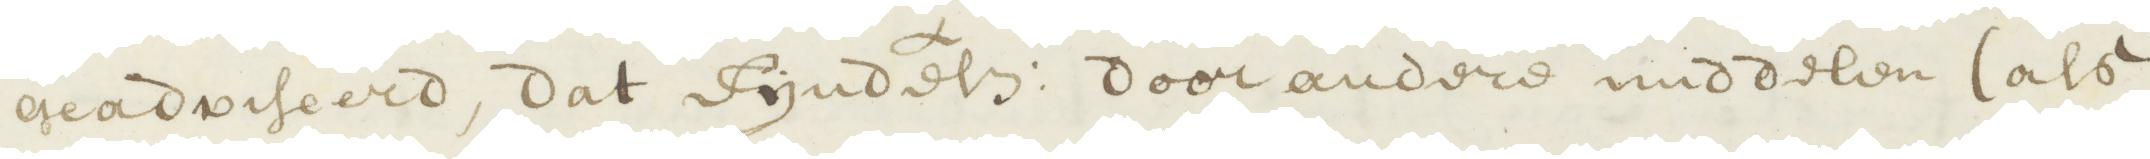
geadviseerd, dat Eijndelijk door andere middelen (als
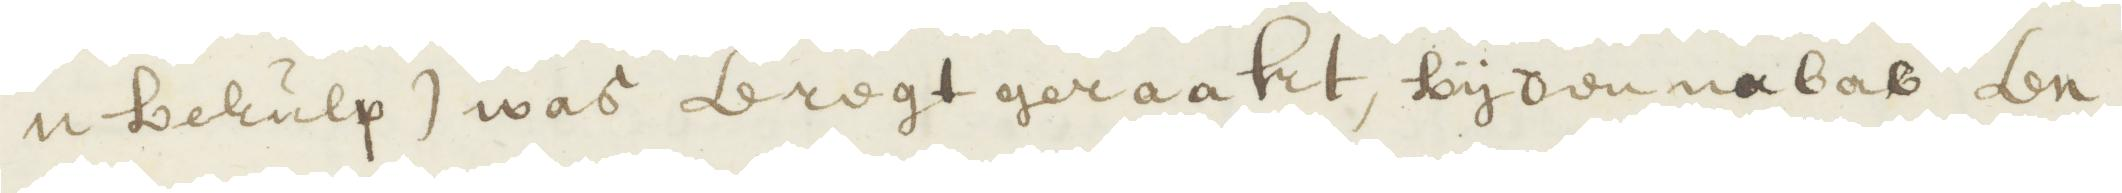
n behulp) was teregt geraakt, bij den nabab ten
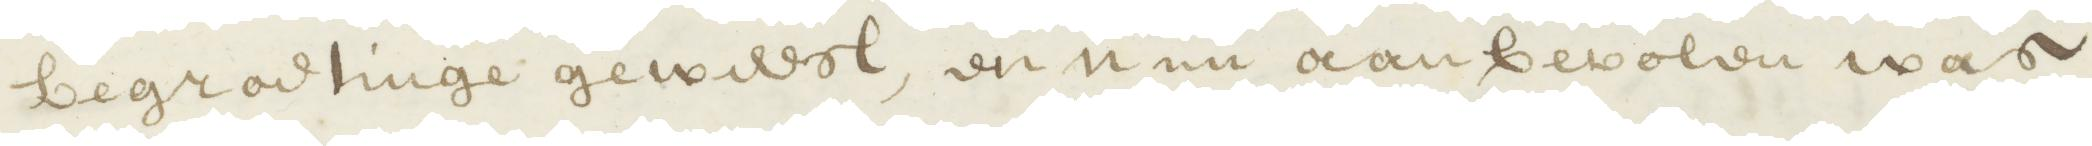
begroetinge geweest, en u nu aan bevolen was
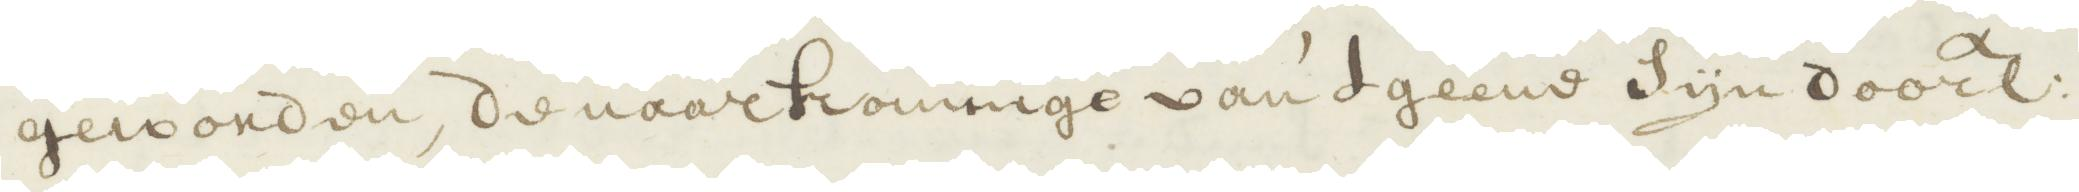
geworden, de naarkominge van 't geene Sijn doorl:
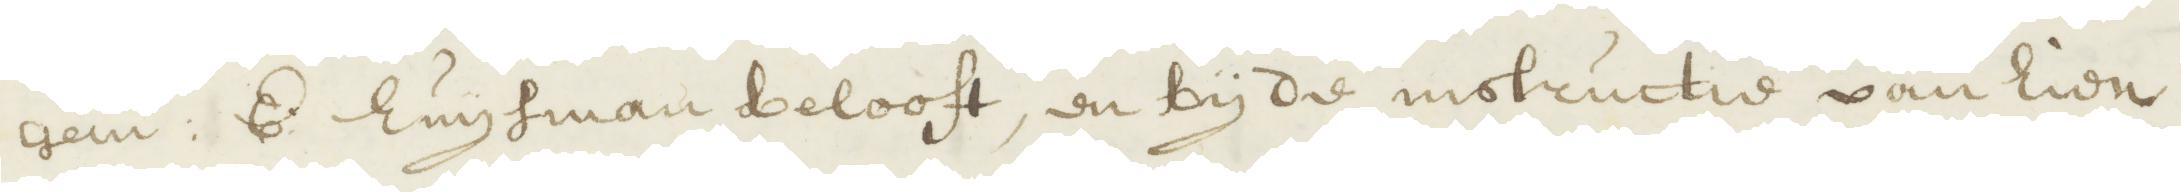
gem: E: huijsman belooft, en bij de instructie van hier
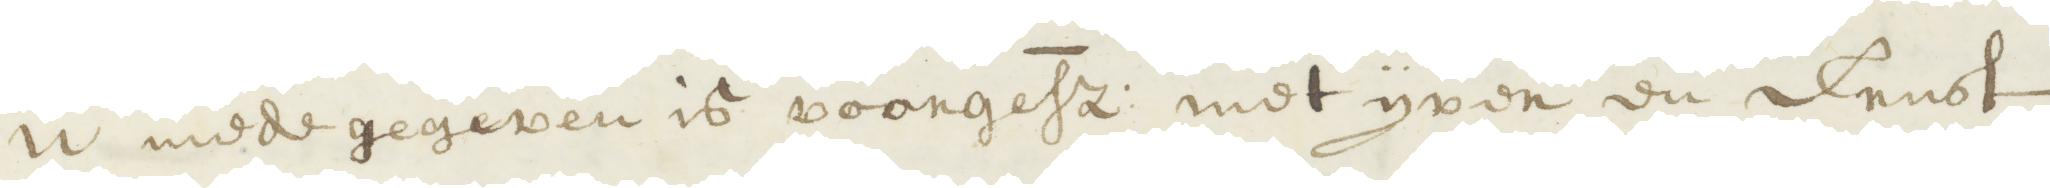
u mede gegeven is voorgesz: met ijver en Ernst
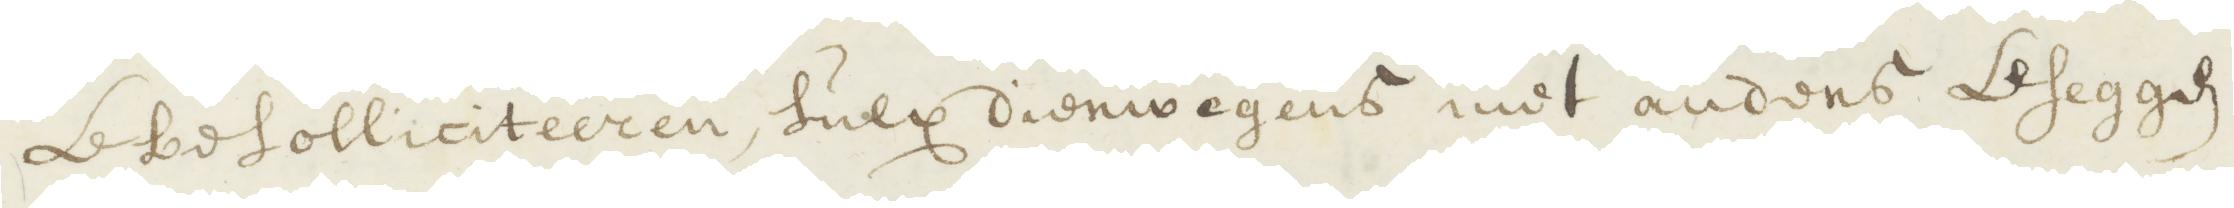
te besolliciteeren, sulx dierwegens niet anders teseggen
